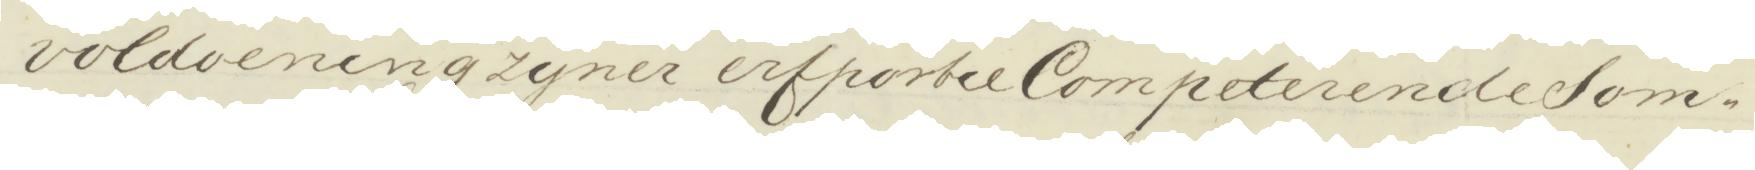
voldoening zyner erfportie Competerende Som„
